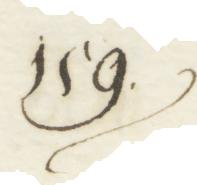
159.
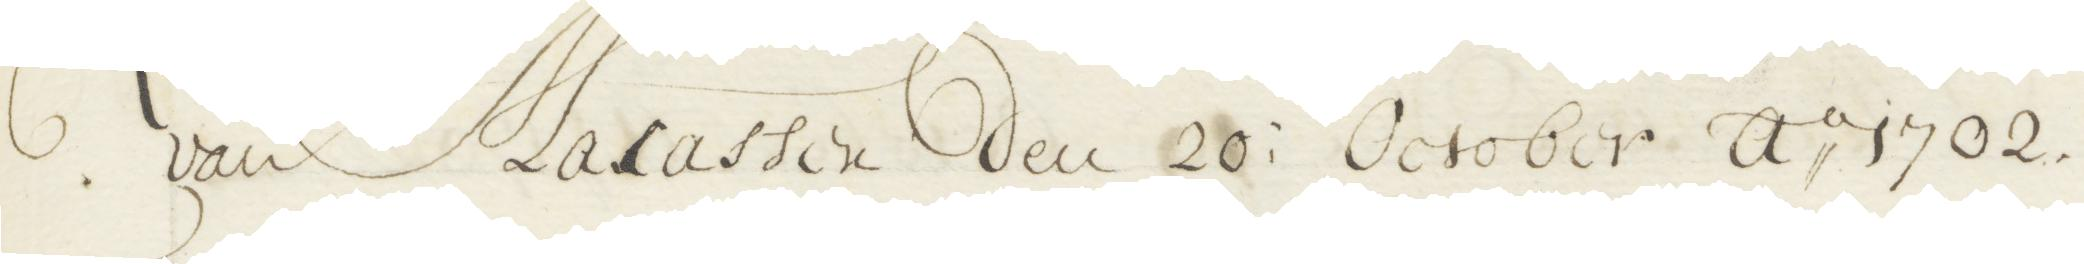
Van Macasser den 20:' October A„o 1702.
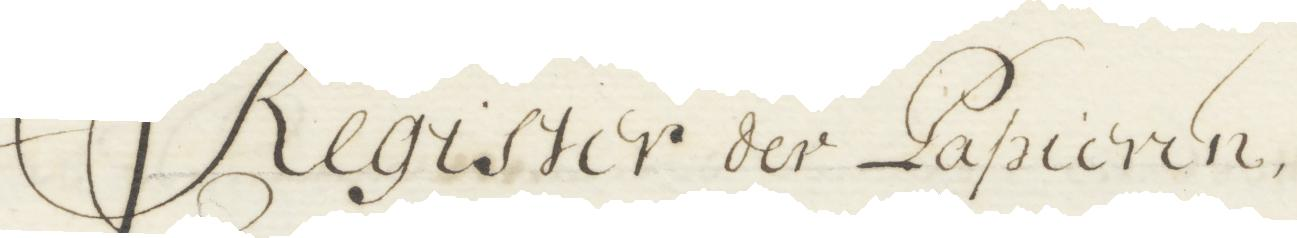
Register der Papieren,
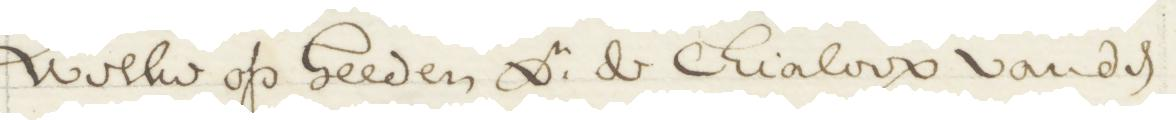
welke op heeden p:r de Chialoep vanden
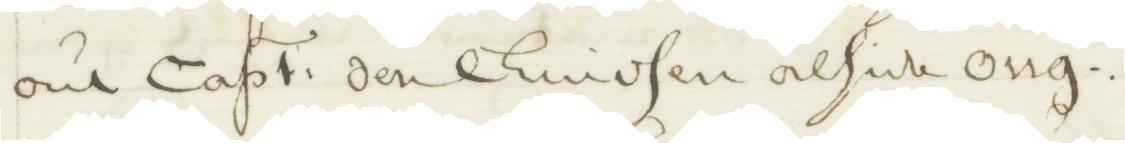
out Capt: der Chinesen alhier Ong-
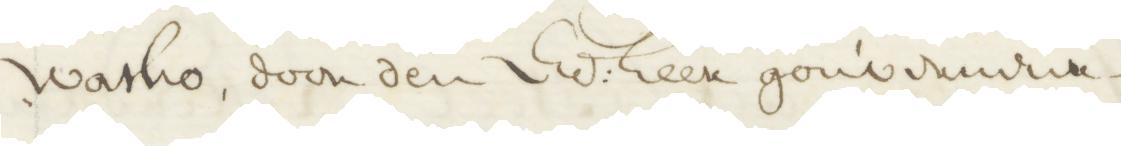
Watko, door den Ed: heer gouverneur
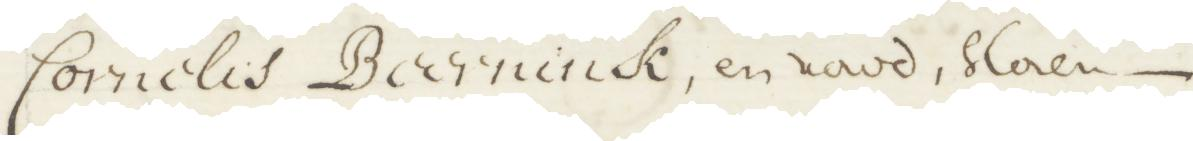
Cornelis Beernink, en raed, staen —
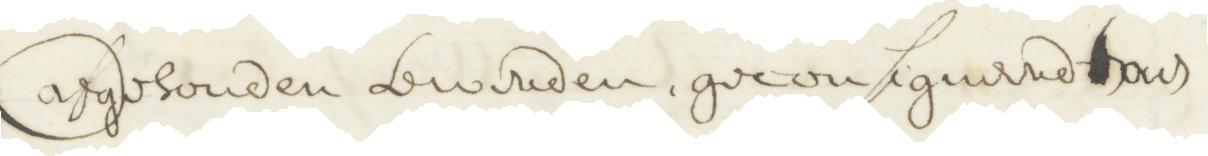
afgesonden tewerden, geconsigneerdt aen
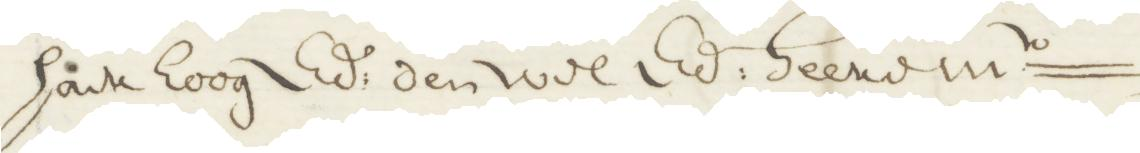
haer hoog Ed:e den wel Ed: heere m=r
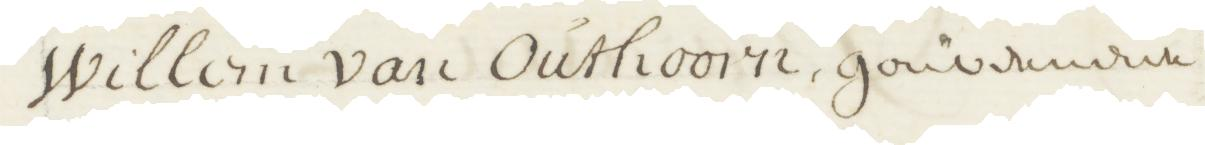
Willem van Outhoorn, gouverneur
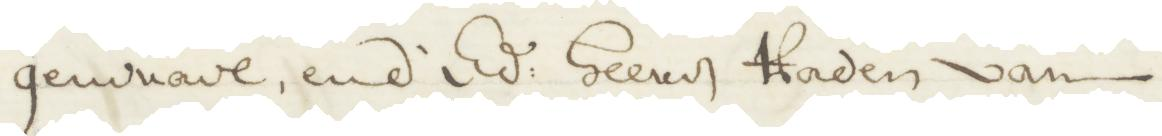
generael, en d’ Ed: heeren Raden van
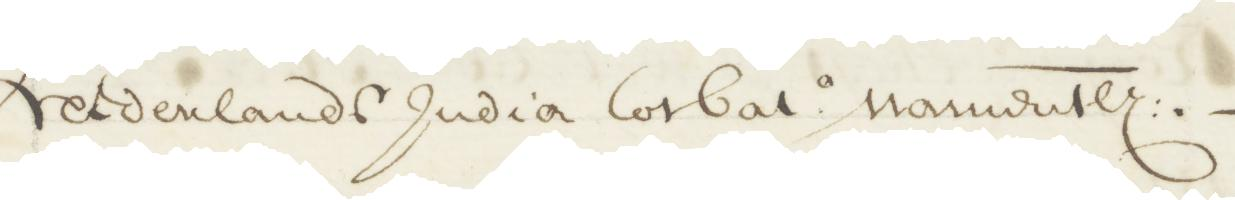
Nederlands Jndia tot bat„a namentlijk —
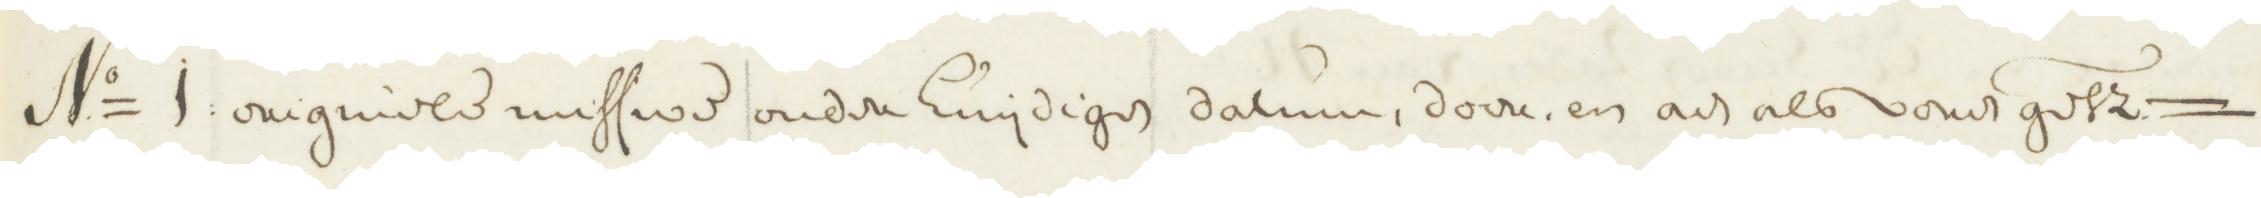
N=o 1: origniele missive onder huijdigen datum, door, en aen als voren gesz:=
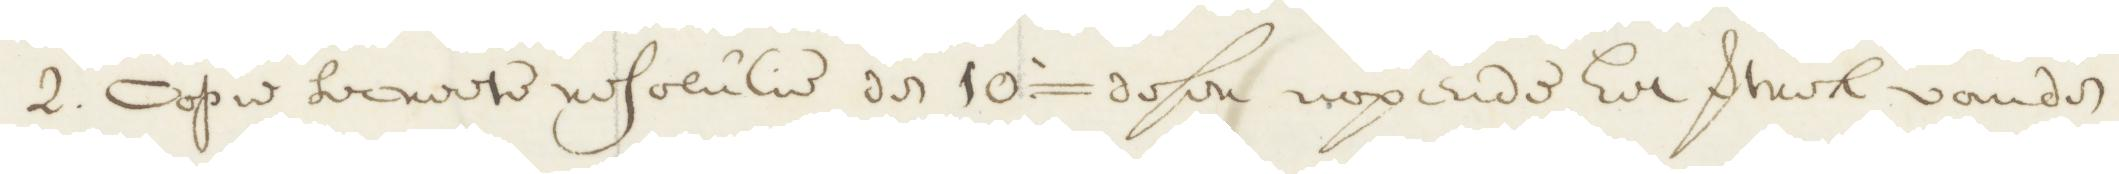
2. Copie secreete resolutie den 10= deser nopende het vertrek van den
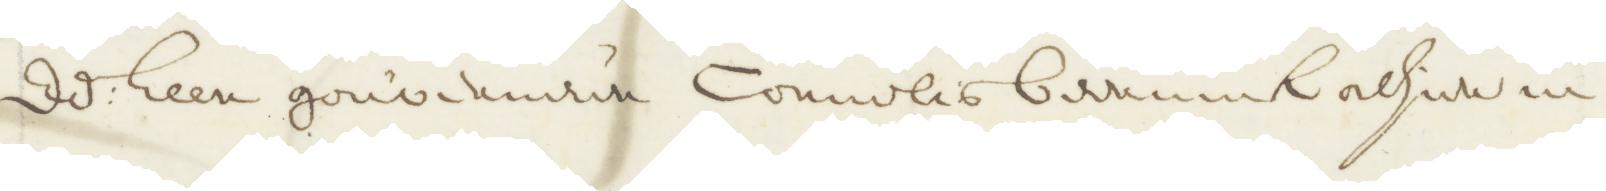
Ed: heer gouverneur Cornelis beernink alhier in
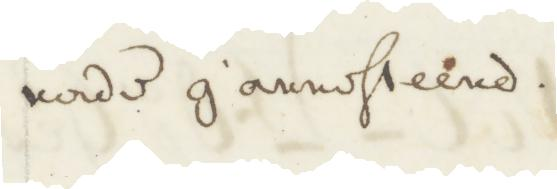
rade g’arresteerd.
